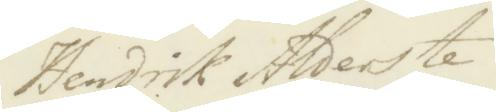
Hendrik Alders te
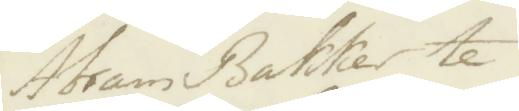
Abram Bakker te
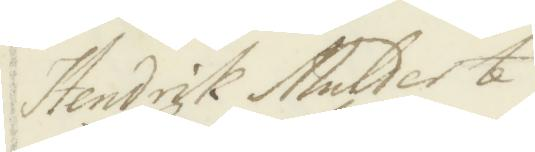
Hendrik Mulder te
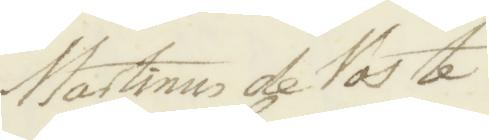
Martinus de Vos te
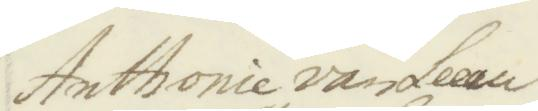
Anthonie van Leeeu
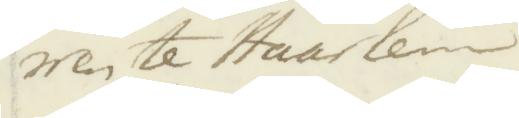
wen te Haarlem
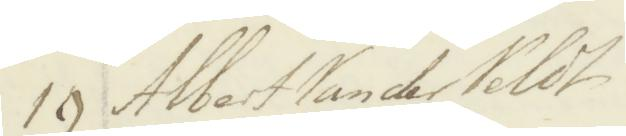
19 Albert Van der Veldt
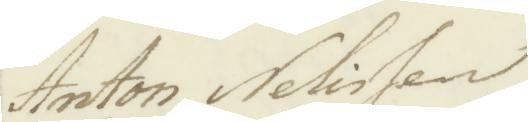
Anton Nelissen
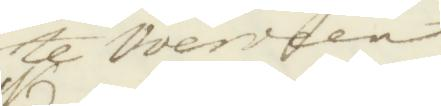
te Overveen
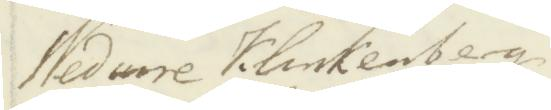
Weduwe Klinkenberg
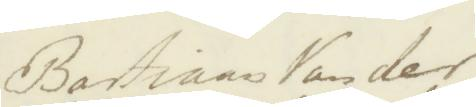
Bastiaan Van der
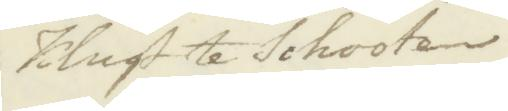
Klugt te Schooten
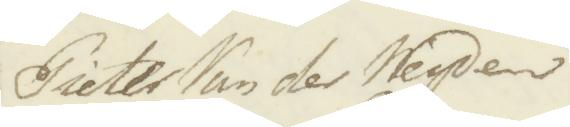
Pieter Van der Weyden
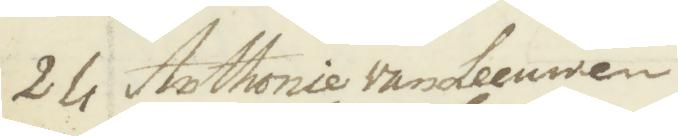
2 4 Anthonie van Leeuwen
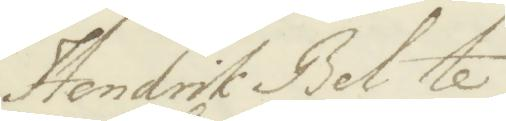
Hendrik Bel te
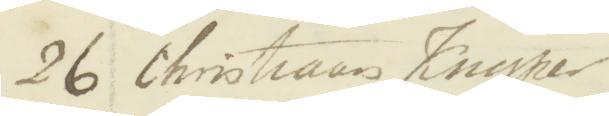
26 Christiaan Kuyper
